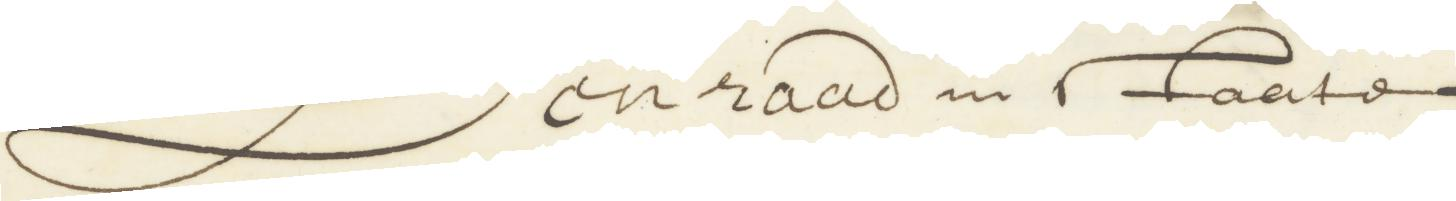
Den raad in staate
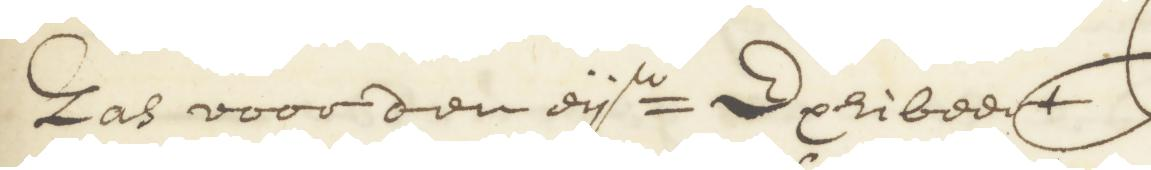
Zas voor den eij=r Exhibeert
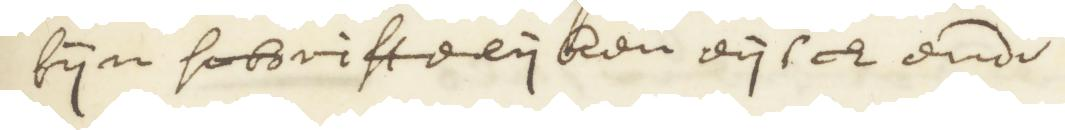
bij in schriftelijken eijsch ende
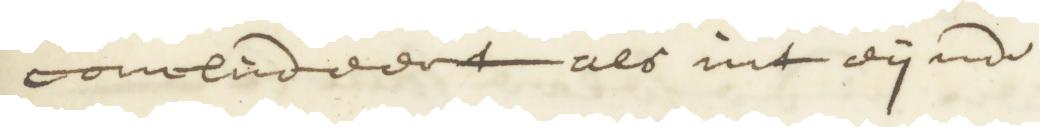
concludeert als int eijnde
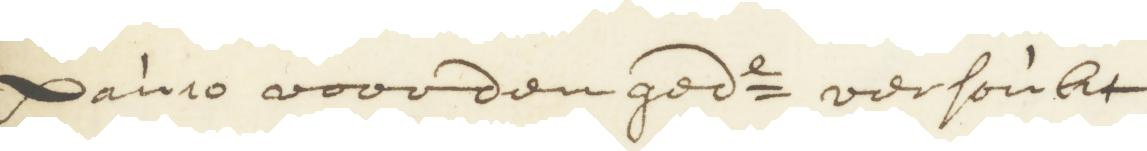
pauw voor den ged=e versoukt
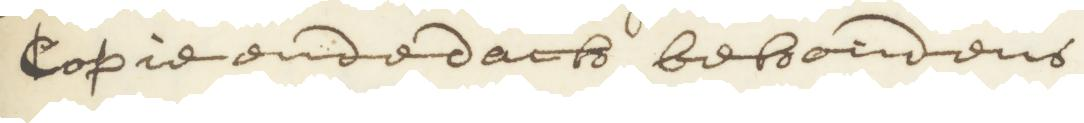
Copie ende dach behoudens
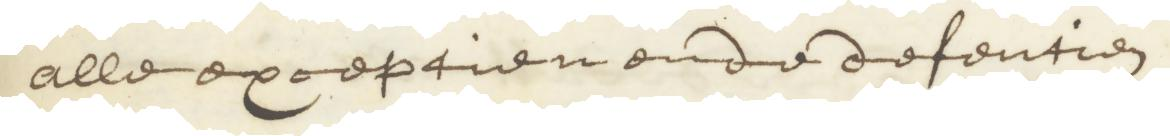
alle exceptien ende defentien
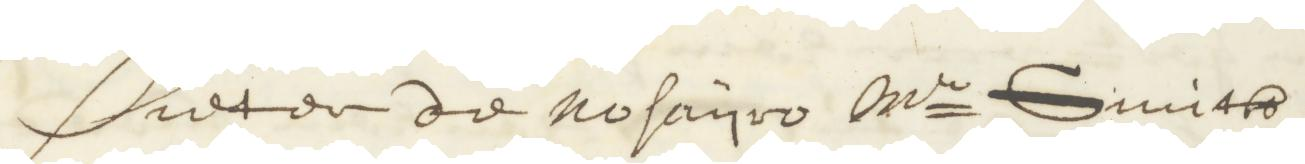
Pieter de rosaijro m=r Smith
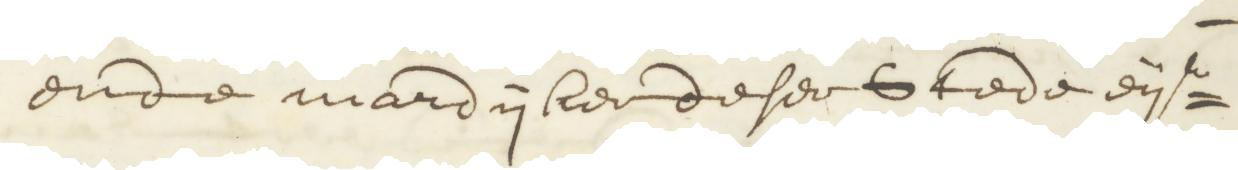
ende mardijker deser stede eij=r
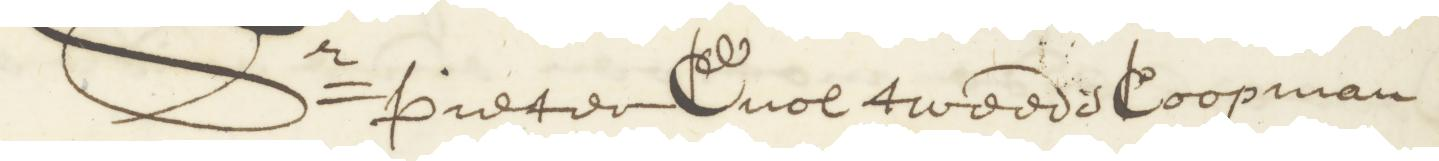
S=r pieter Cnol tweede Coopman
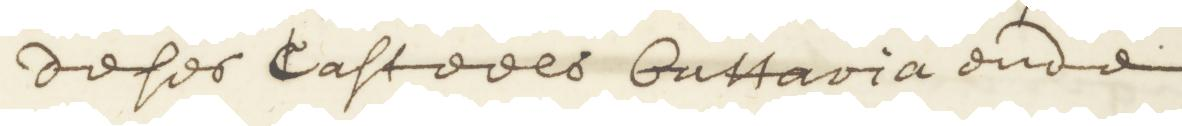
deses Casteels battavia ende
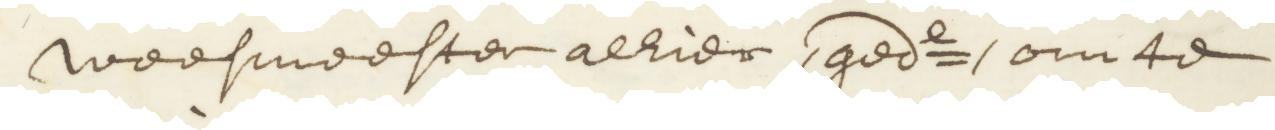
weesmeester alhier, ged=e, om te
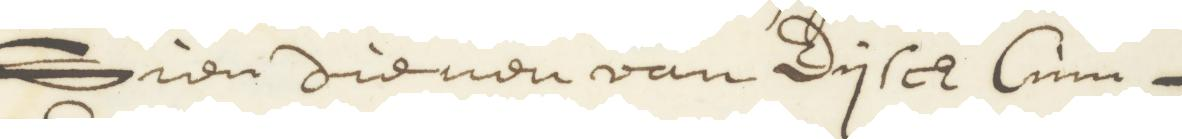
Sien dienen van Eijsch Cum
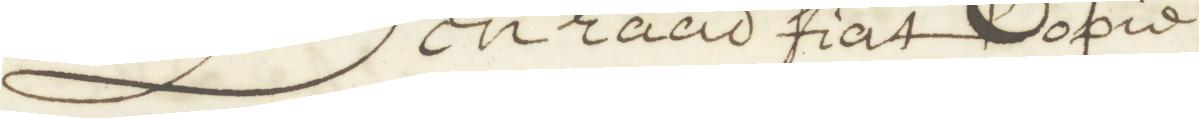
Den raad fiat Copie
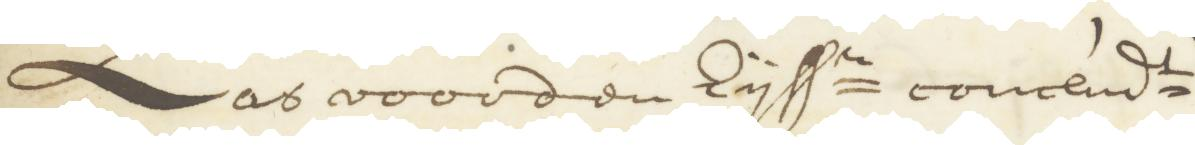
Zas voor den Eijss=r conclud=t
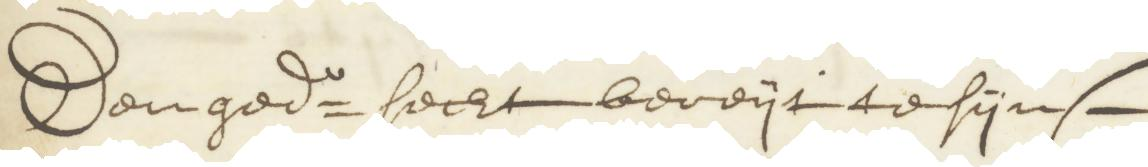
Den ged=e secht bereijt te sijn —
